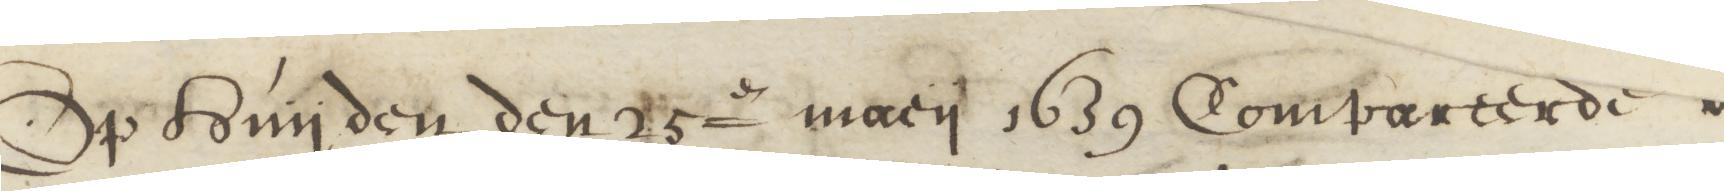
Op huijden den 25=en maeij 1639 Compareerde
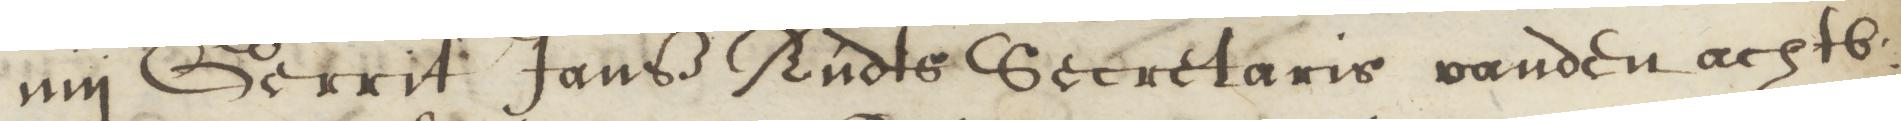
mij Gerrit Jansz Rudts Secretaris van den achtb:
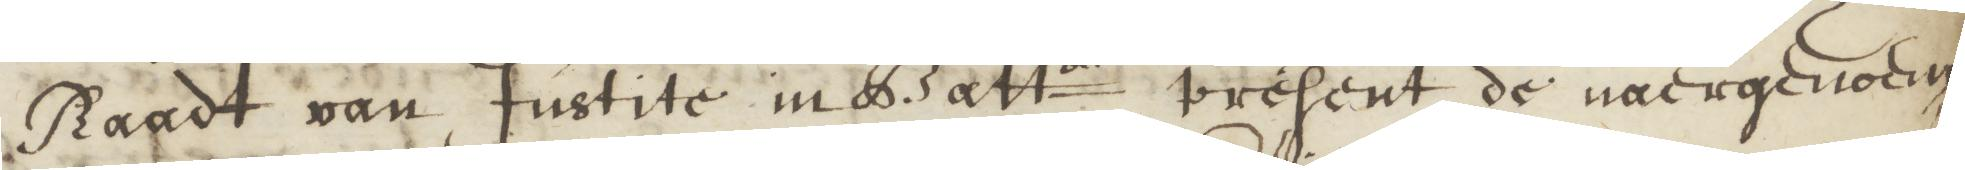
Raadt van Justite in Batt=a present de naergenoem
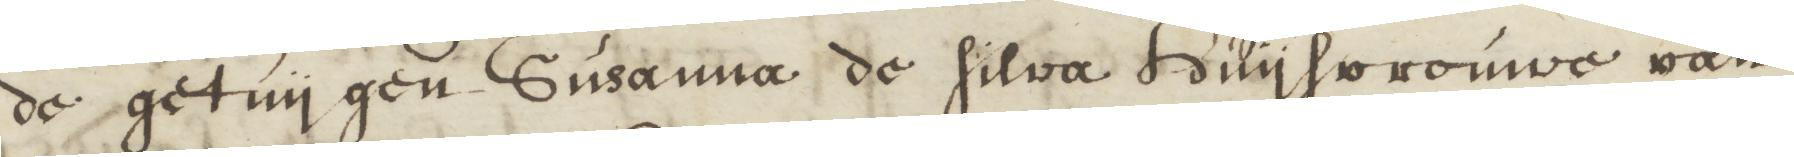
de getuijgen Susanna de silva huijsvrouwe van
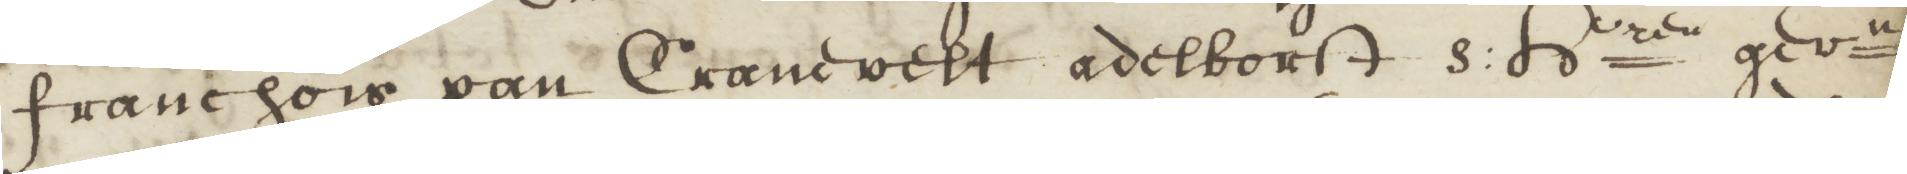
franchois van Cranevelt adelborst d: H=ren gev=n
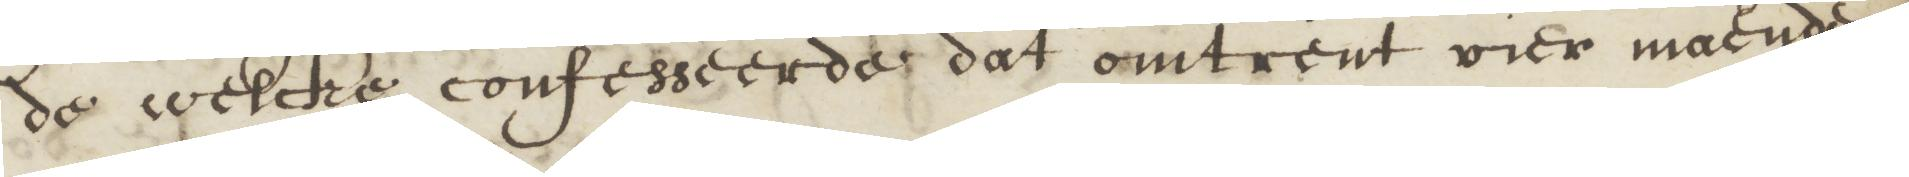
de welcke confesseerde dat omtrent vier maenden
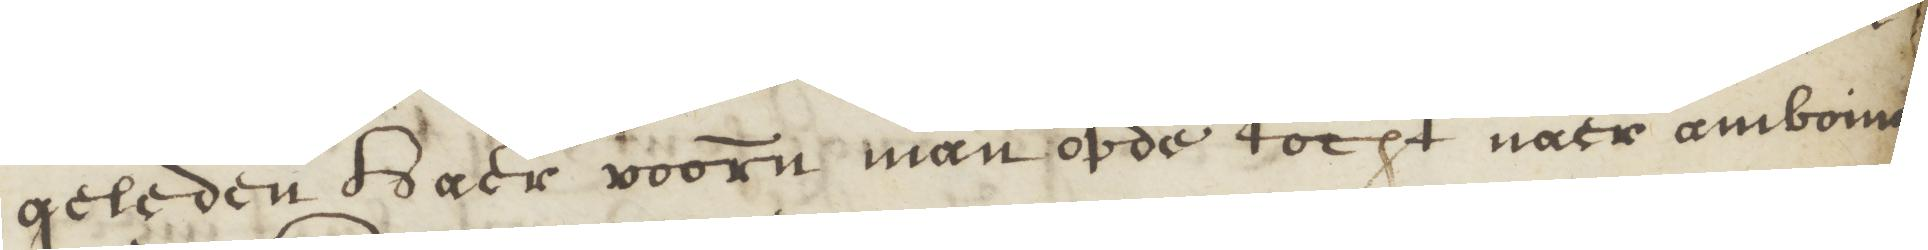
geleden haer voorn man op de tocht naer amboina
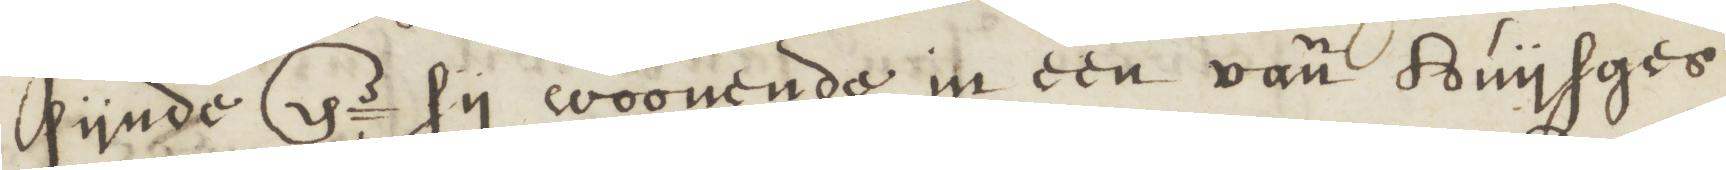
sijnde ende sij woonende in een van huijsges
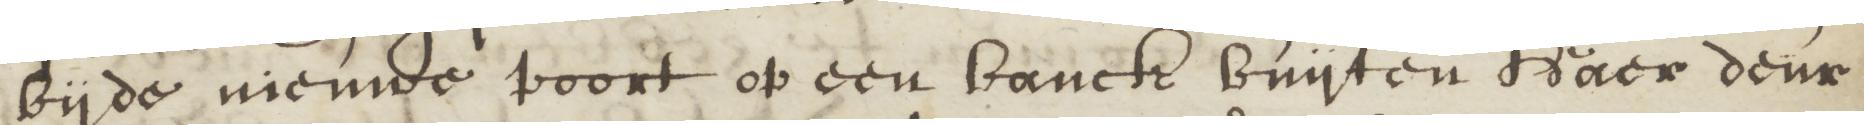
bijde nieuwe poort op een banck buijten Haer deur
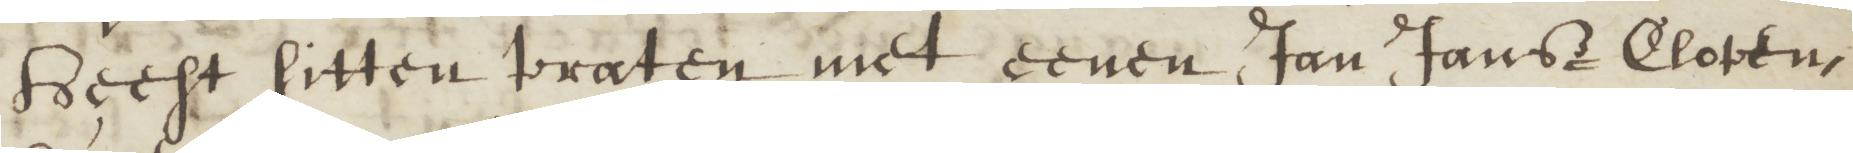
heeft sitten praten met eenen Jan Jans=z Clopen,
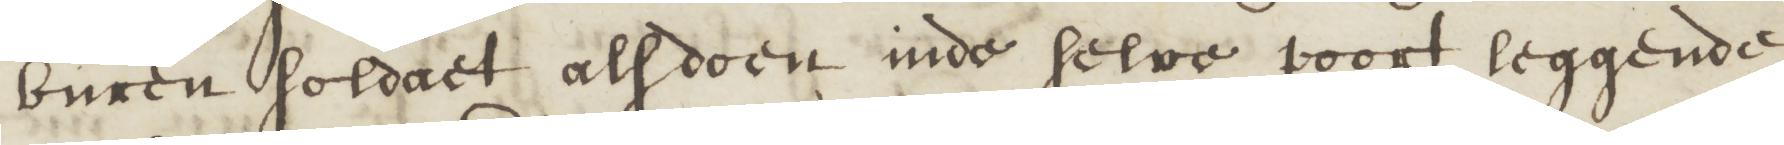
buren soldaet als doen inde selve poort leggende
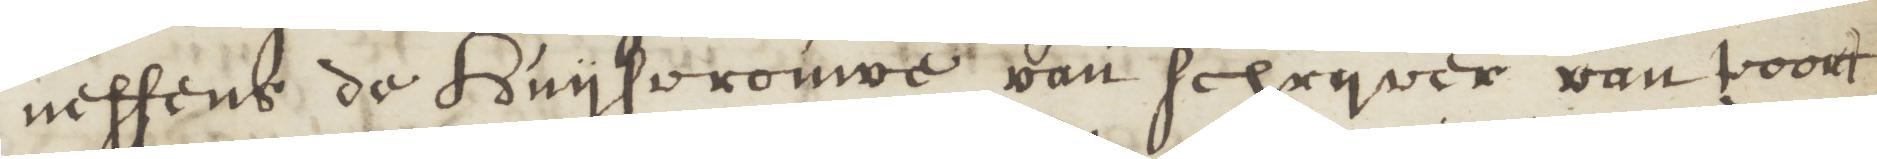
neffens de Huijsvrouwe van schryver van poort
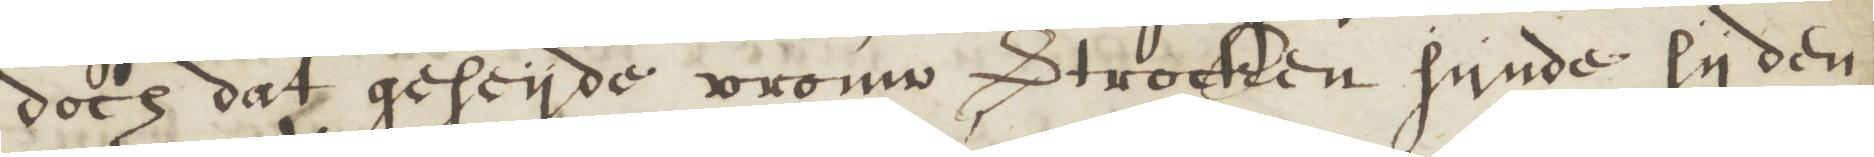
doch dat geseijde vrouw vertrocken sijnde, sij den
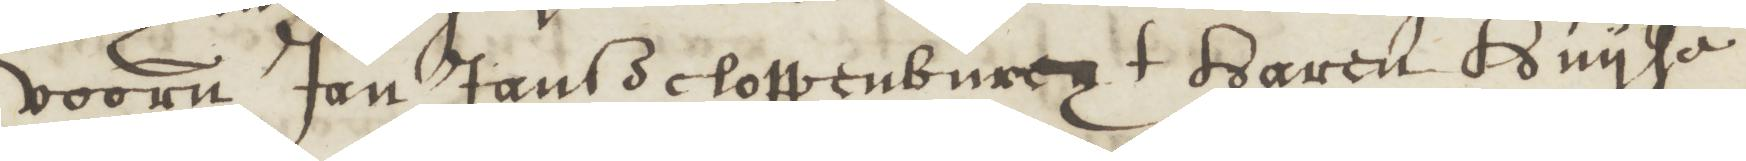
voorn Jan Jansz cloppenburch t haren huijse
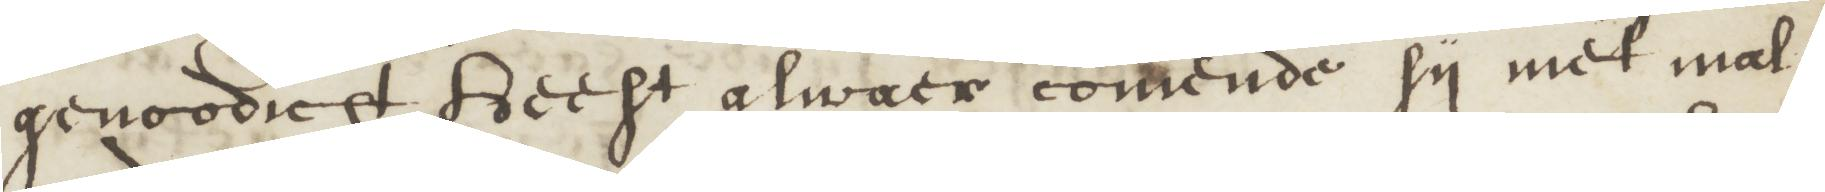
genoodicht heeft alwaer comende sij met mal
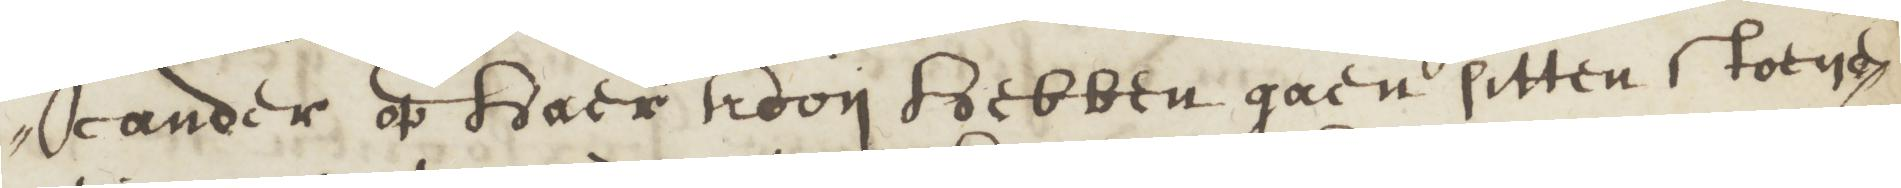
„cander op haer kooij hebben gaen sitten stoeyen
